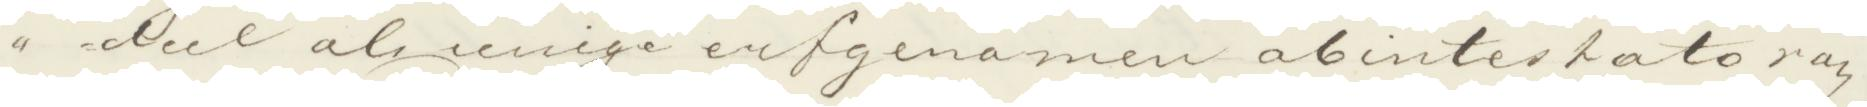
„ „deel als eenige erfgenamen ab intestato van
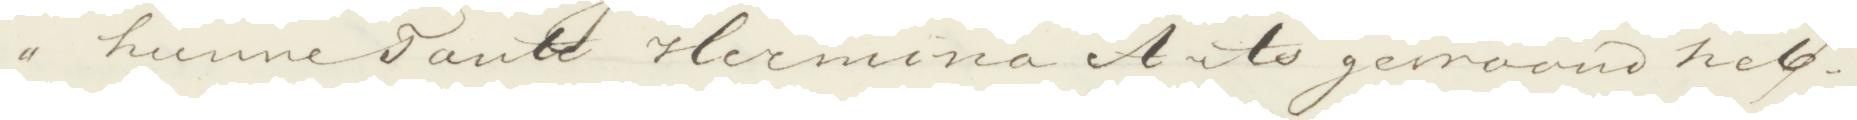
„ hunne Tante Hermina Arts gewoond heb„
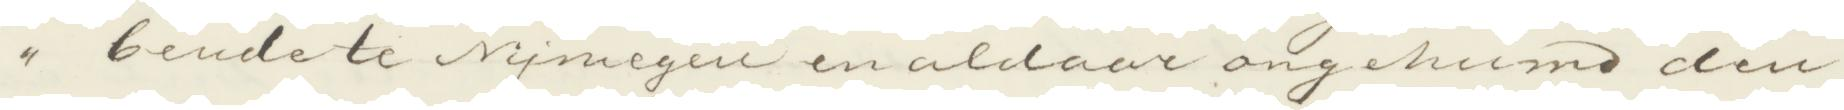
„ bende te Nijmegen en aldaar ongehuwd den
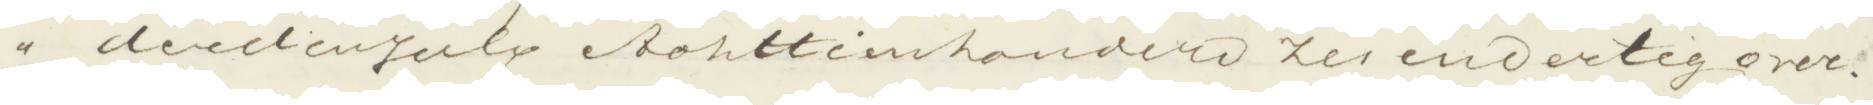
„ derden July Achttienhonderd zes endertig over„
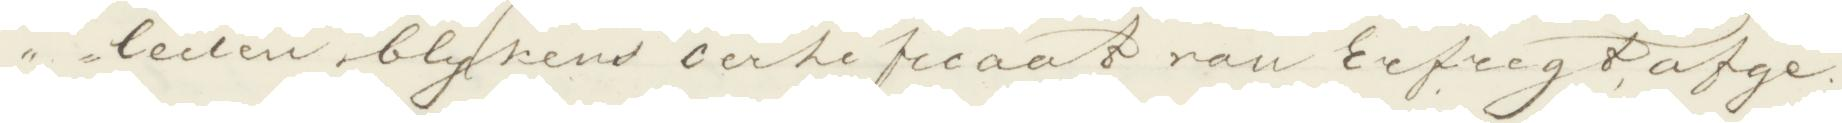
„ „leden, blykens certificaat van Erfregt, afge.
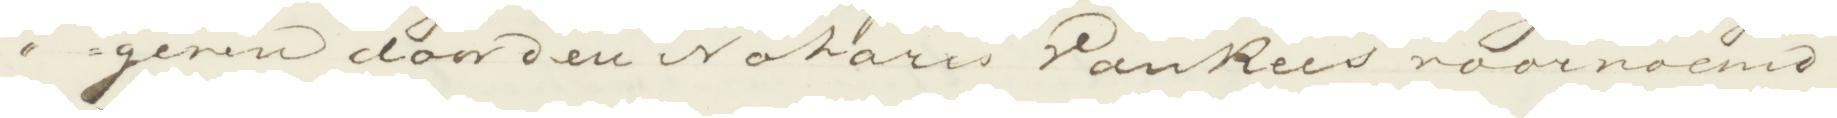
„ „geven door den Notaris Van Rees voornoemd
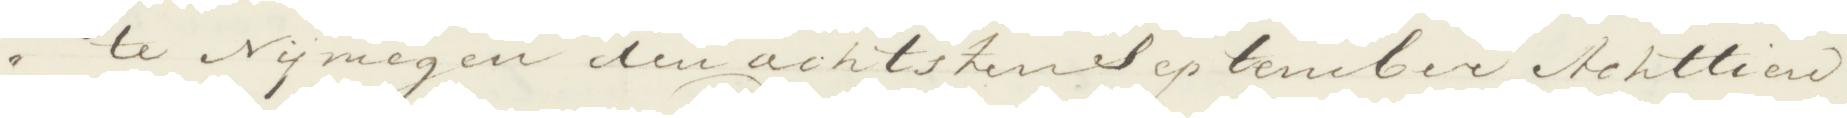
te Nijmegen den achtsten september Achttien
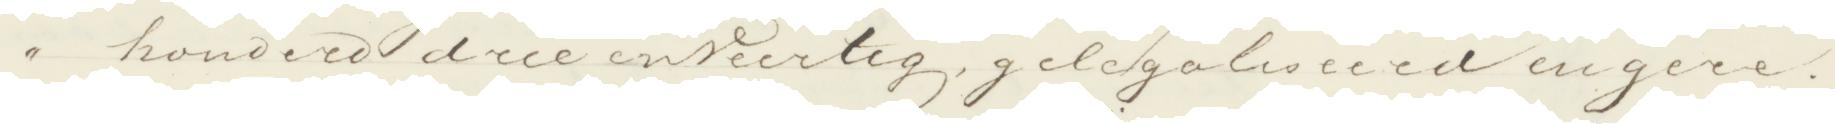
„ honderd drie en Veertig, gelegaliseerd en gere.
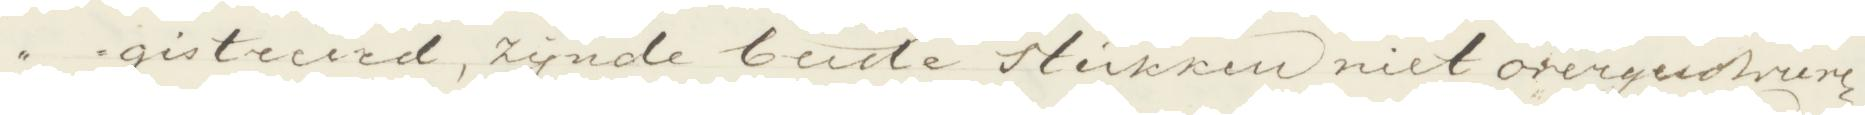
„ „gistreerd, zijnde beide stukken niet overgeschreven
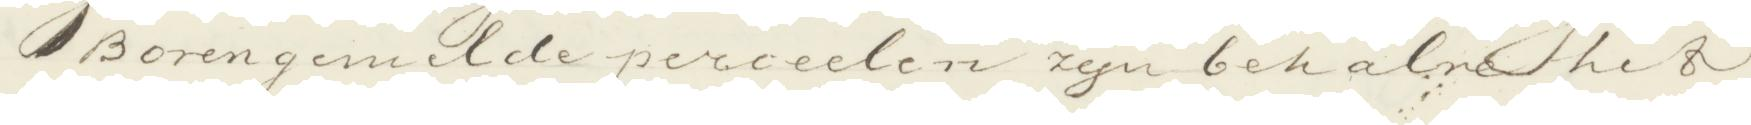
Bovengemelde perceelen zyn behalve het
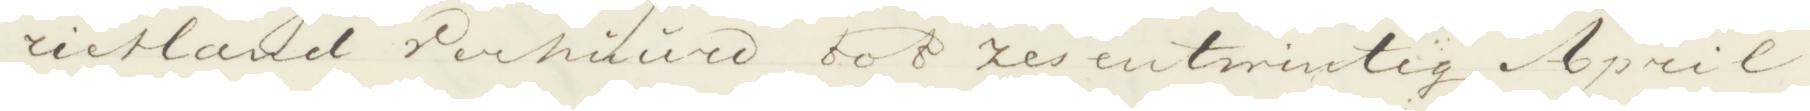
rietland Verhuurd tot zes en twintig April
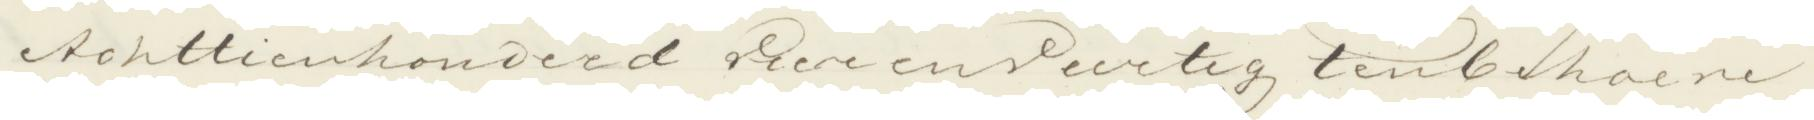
Achttienhonderd Vier en Veertig ten behoeve
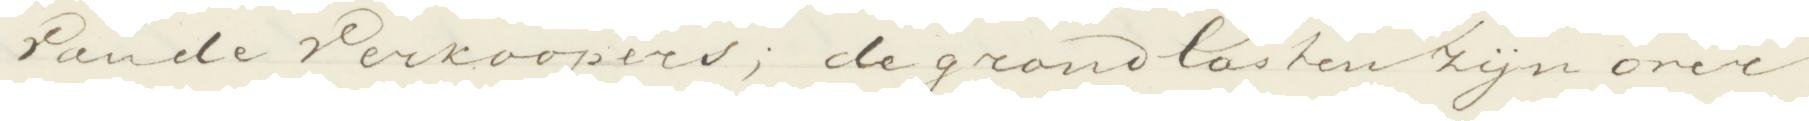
Van de Verkoopers; de grond lasten zijn over
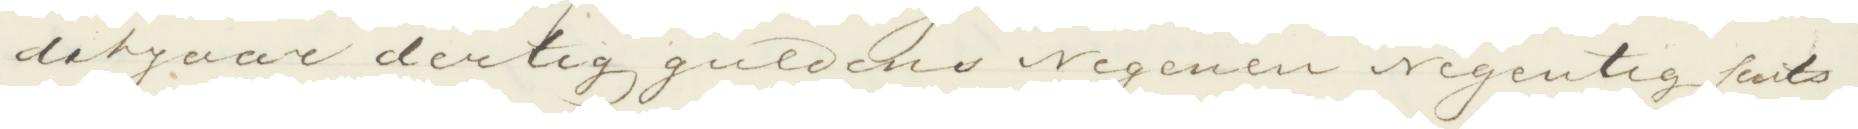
dit jaar dertig guldens Negenen Negentig Cents,
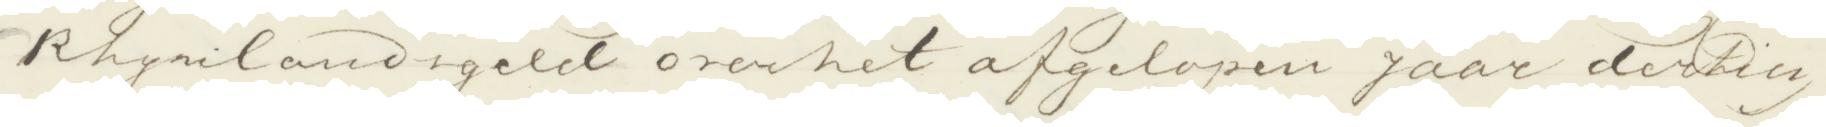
Rhynlandsgeld over het afgelopen jaar dertien
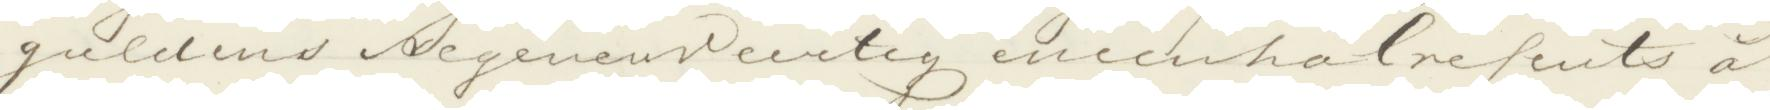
guldens Negenen Veertig en een halve Cents à
